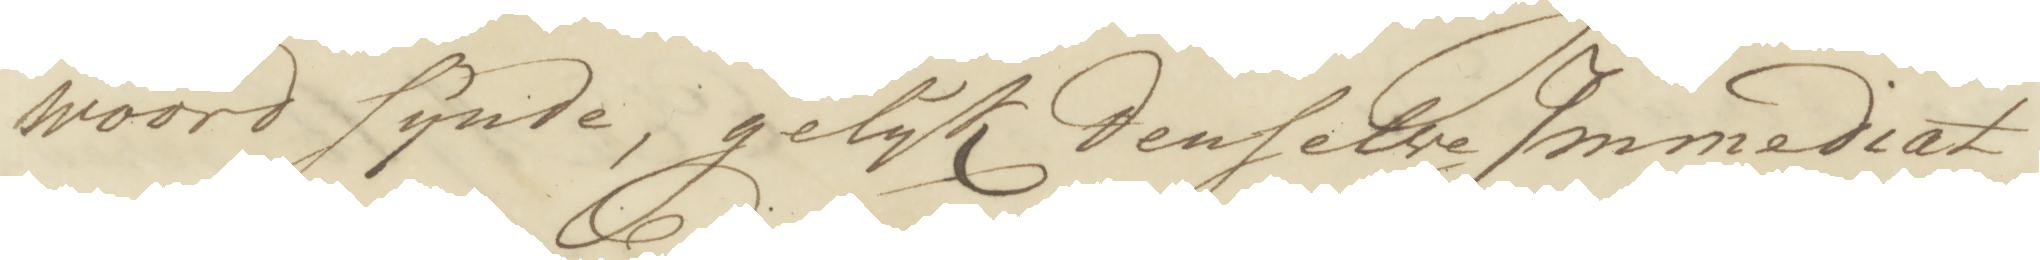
woord Sijnde, gelijk denselve Jmmediat
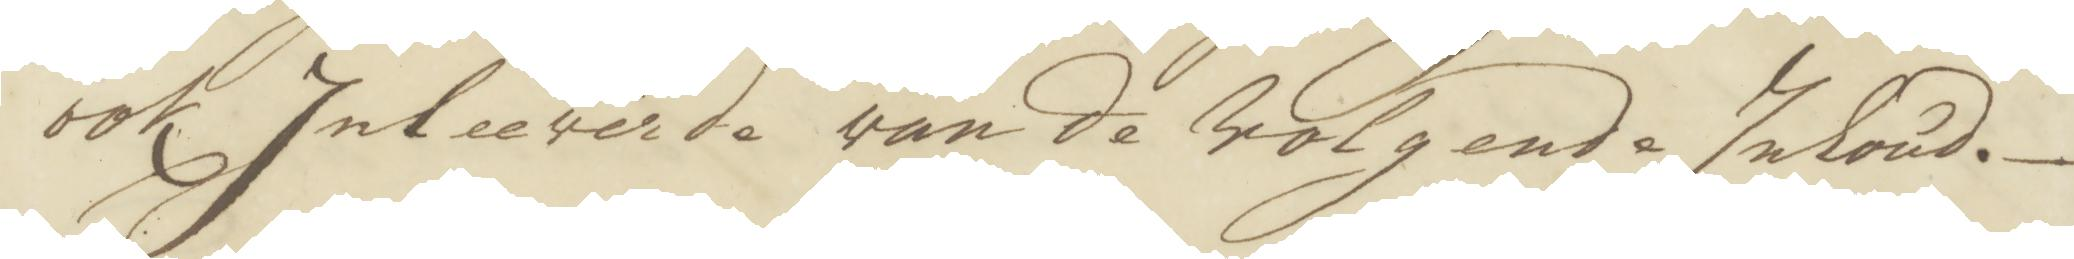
ook Jnleeverde van de volgende Jnhoud.
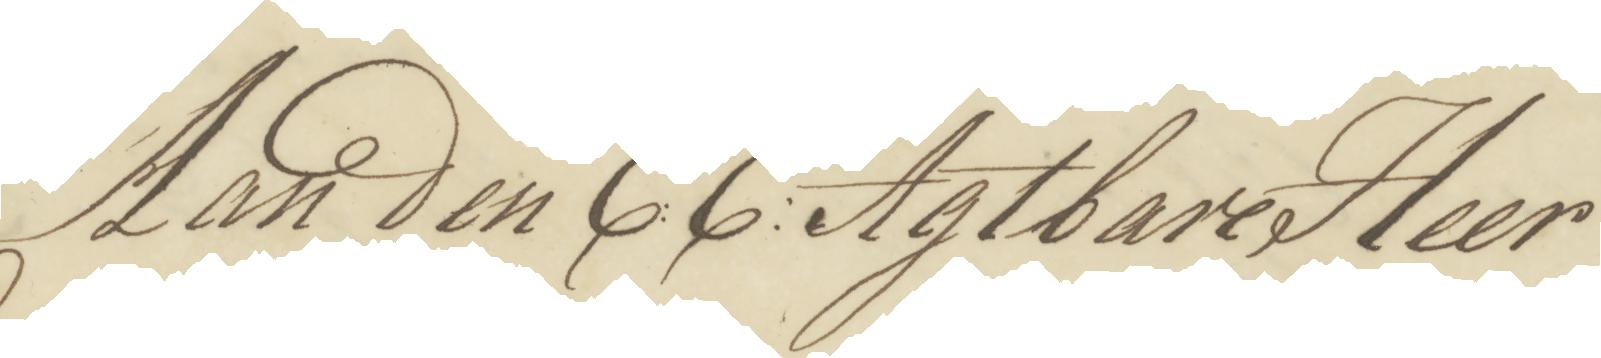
Aan den E:E: Agtbare Heer
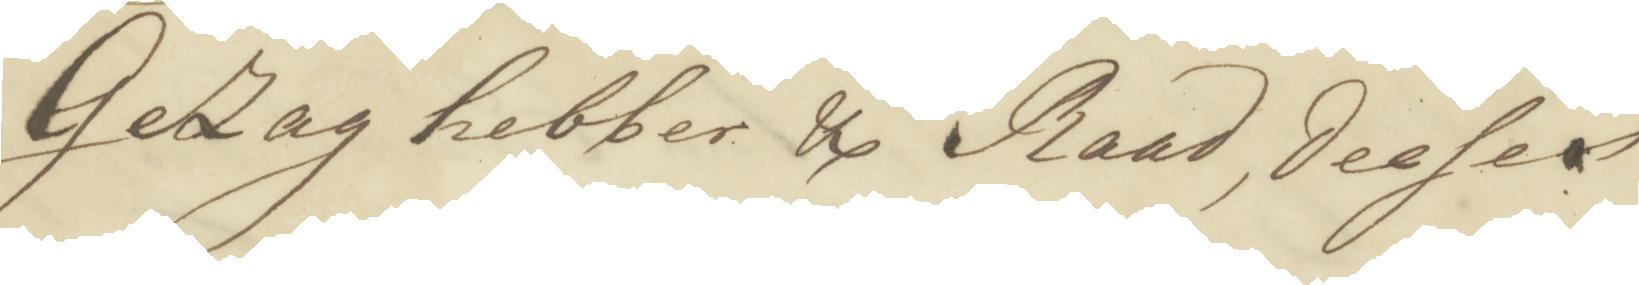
Gezag hebber & Raad, deeses
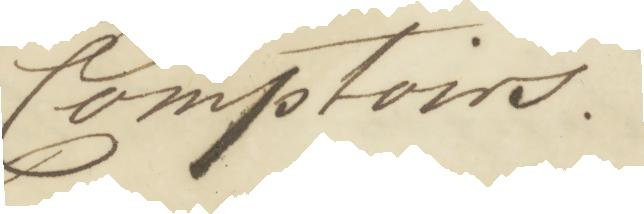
Comptoirs.
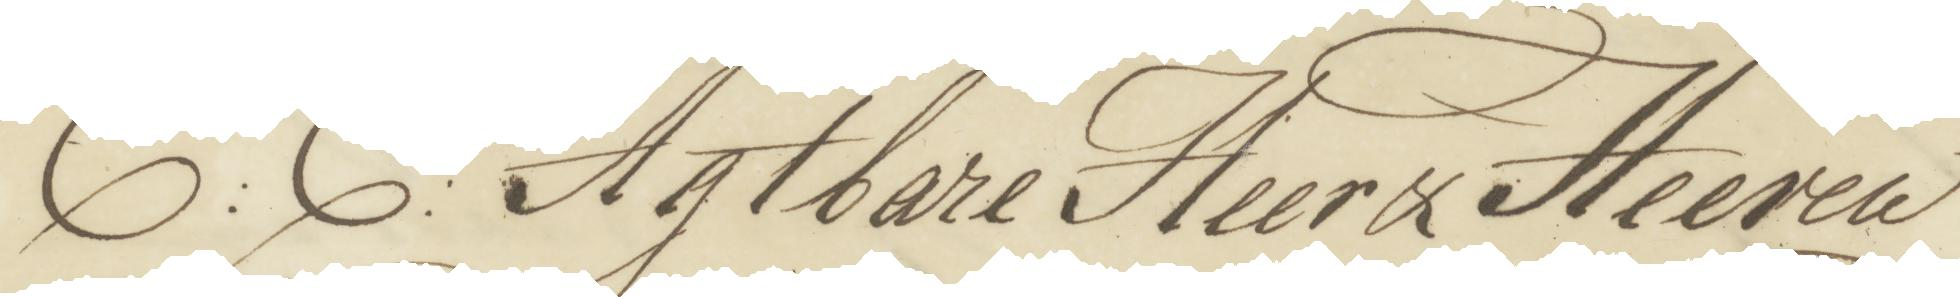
E:E: Agtbare Heer: Heeren!
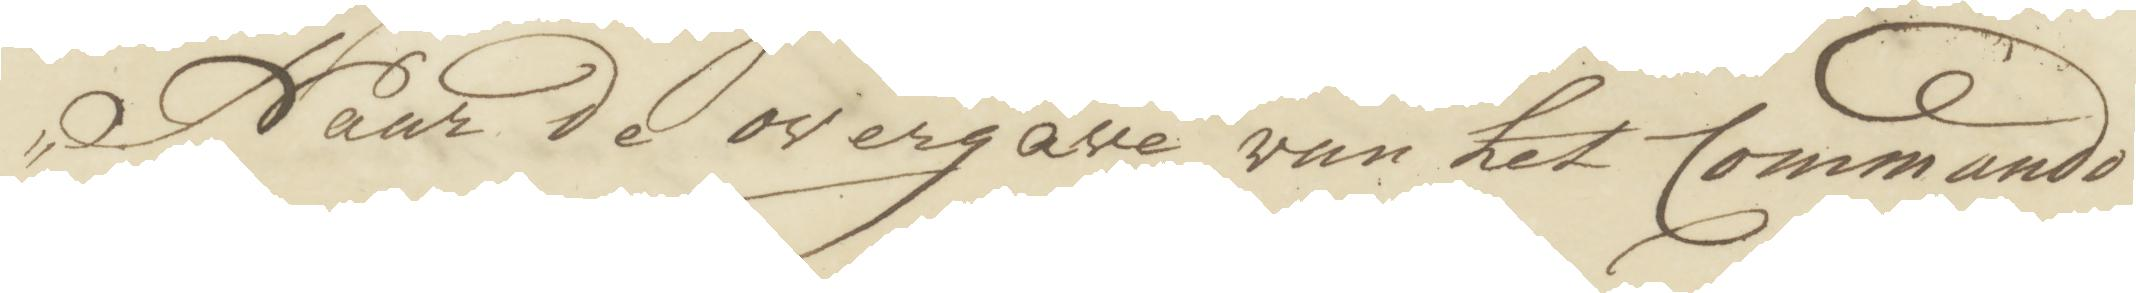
„Naar de overgave van het commando
